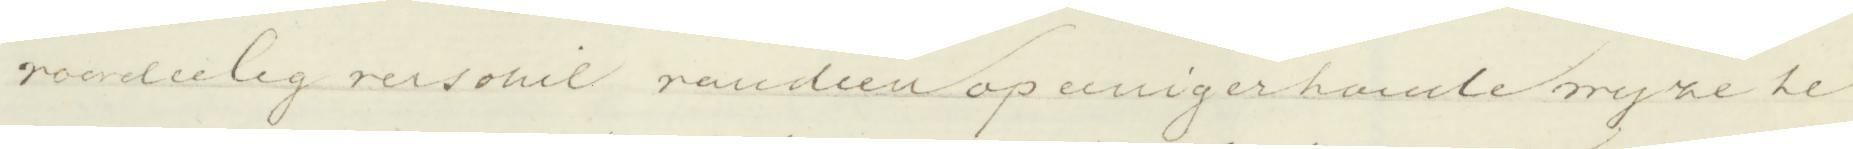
voordeelig verschil vandien op eenigerhande wyze te
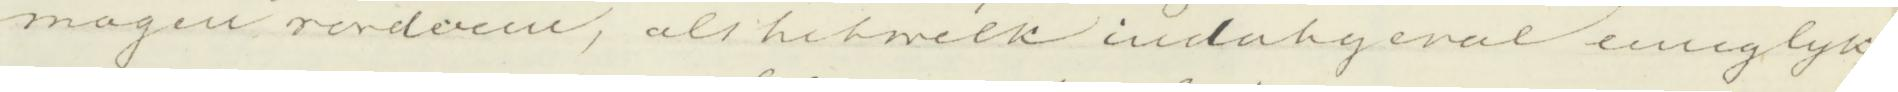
mogen vorderen, als hetwelk indatgeval eeniglyk
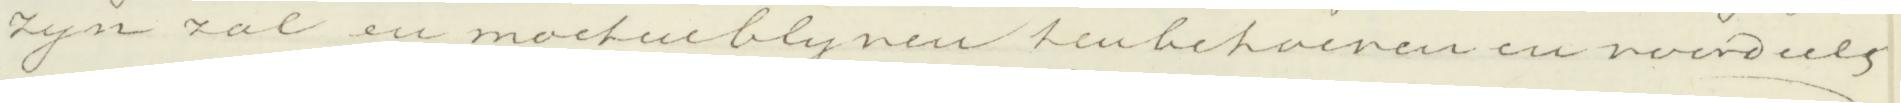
zyn zal en moetenblyven tenbehoeven en voordeele
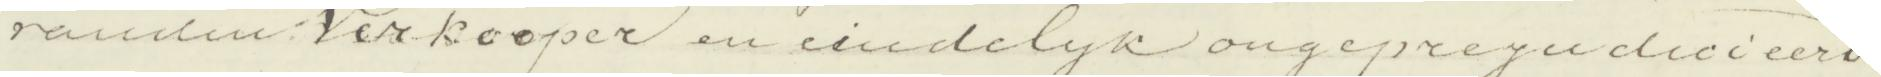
van den Verkooper en eindelyk ongeprejudicieerd
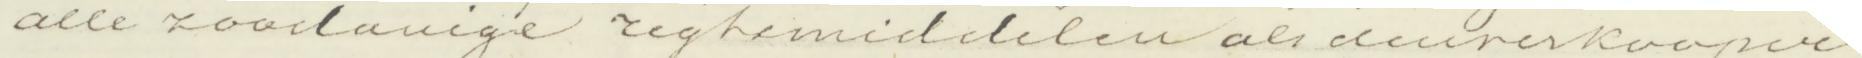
alle zoodanige regtsmiddelen als denverkooper
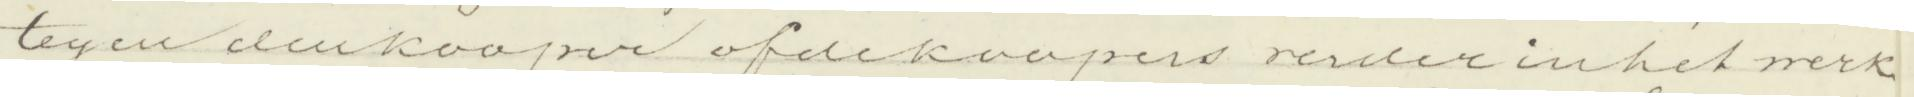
tegen denkooper ofdekoopers verder inhet werk
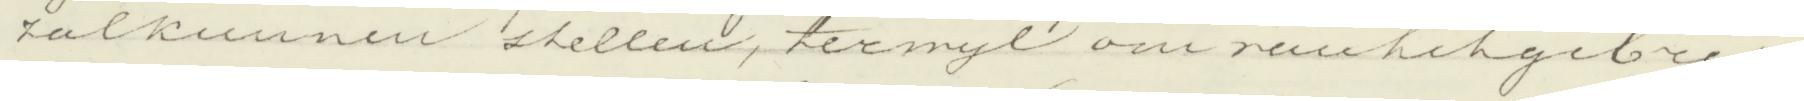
zalkunnen stellen, terwyl om vanhetgebrek
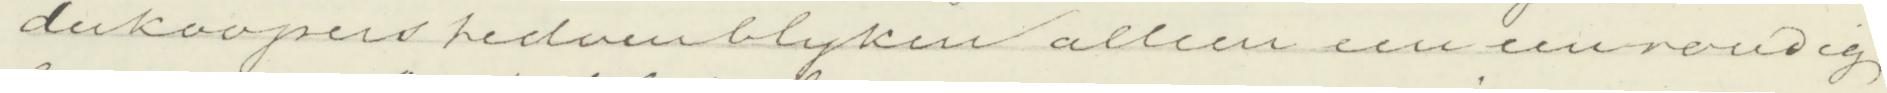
derkoopers tedoenblyken alleen een eenvoudig
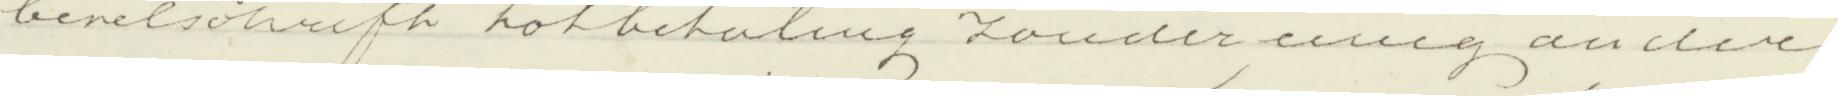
bevelschrift tot betaling zonder eenig ander
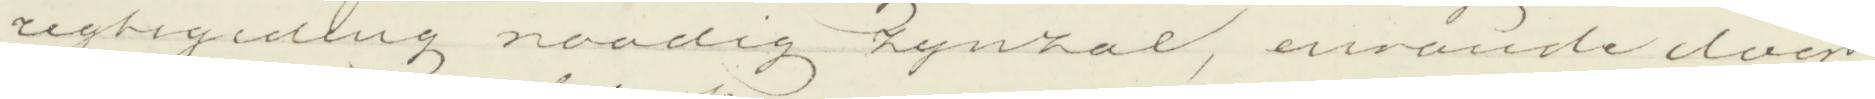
regtsgeding noodig zynzal, envande door
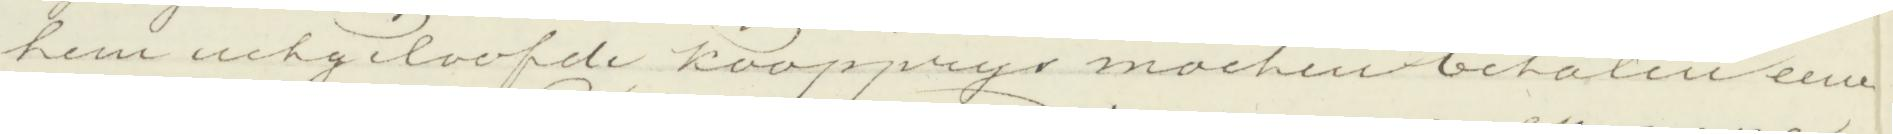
hem uitgeloofde koopprys moeten betalen eene
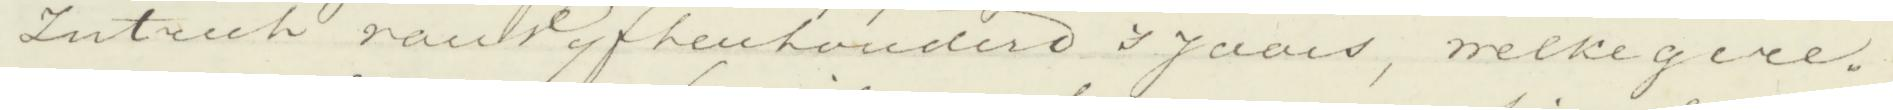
Intrest van Vyftenhonderd 's Jaars, welke gere„
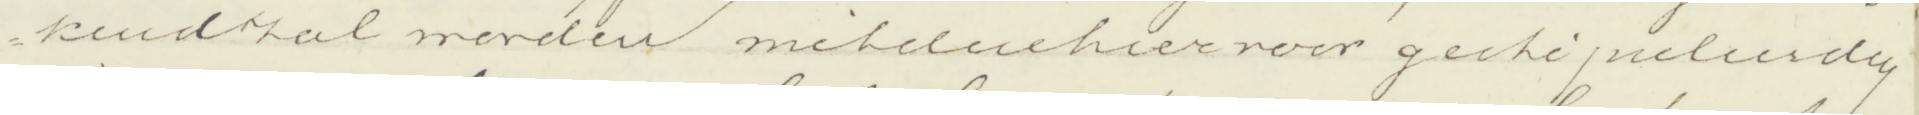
=kend zal worden metdenhiervoor gestipuleerden
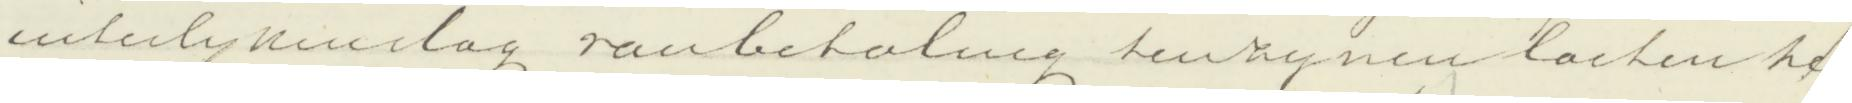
uiterlykendag vanbetaling tenzynen losten te
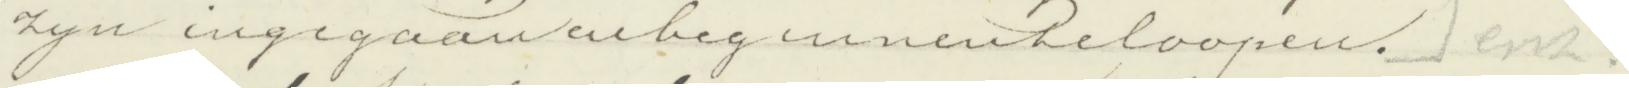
zyn ingegaan enbeginnenteloopen] enz
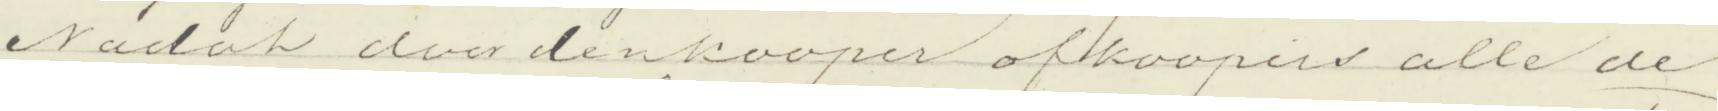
Nadat door denkooper of koopers alle de
